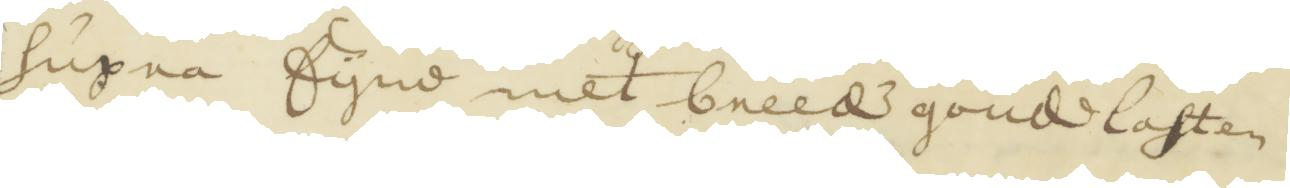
supra fijne met breede goude lasten
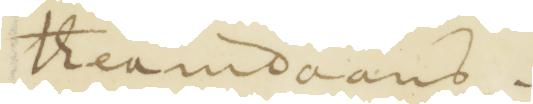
thermdaans
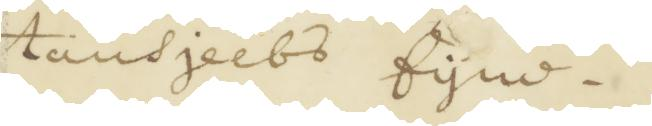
tansjeebs fijne
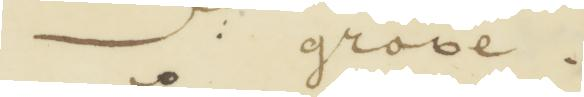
_:o grove
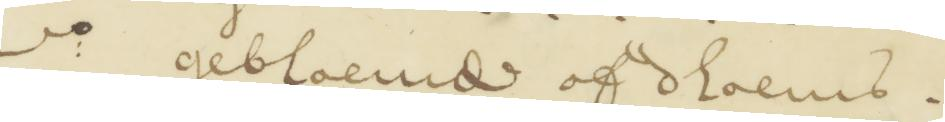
d:o gebloemde of d'hoems
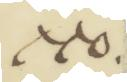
550.
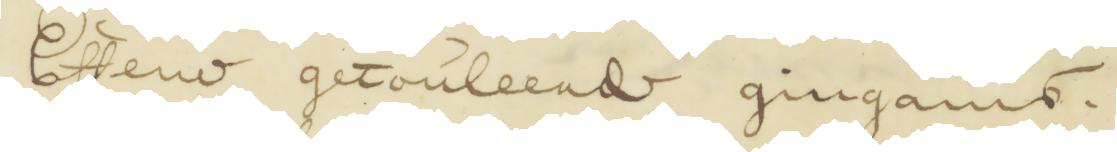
Effene gecouleerde gingams
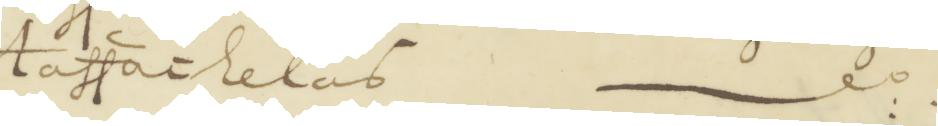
taffachelas _:o
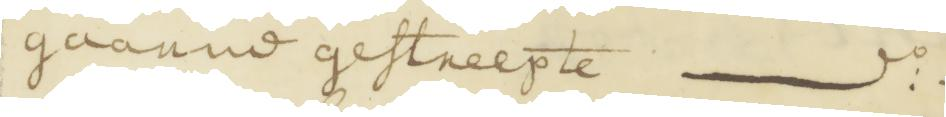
gaarne gestreepte _:o
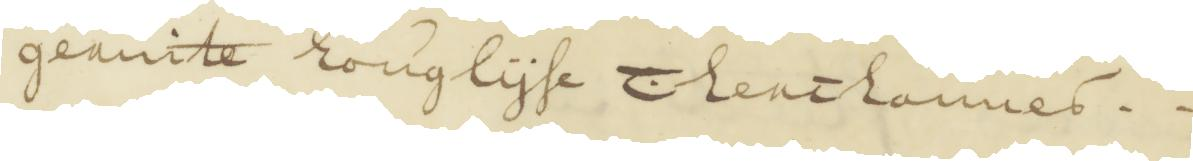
geruite houglijse cherchonnes
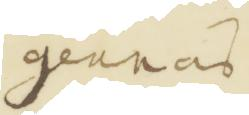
gerras
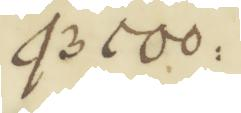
43500:
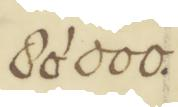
80'000.
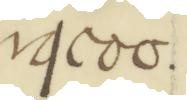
14500.
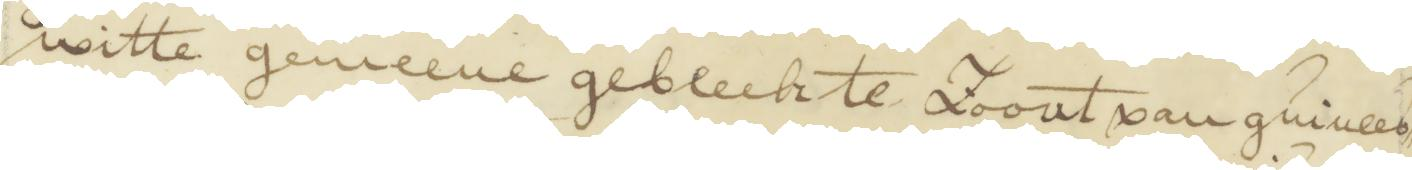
witte gemeene gebleekte Zoort van guinees
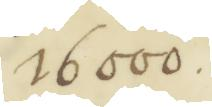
16000.
